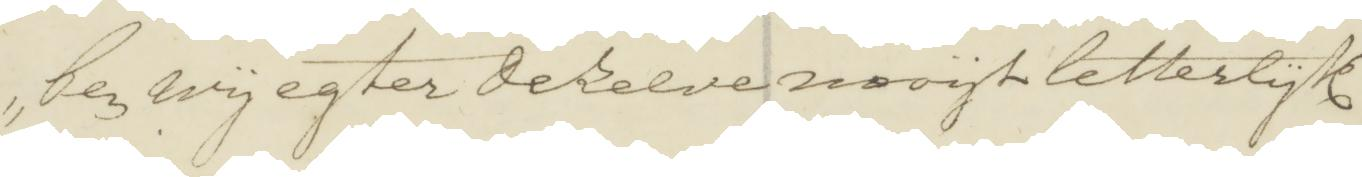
„ben wij egter dezelve nooijt letterlijk
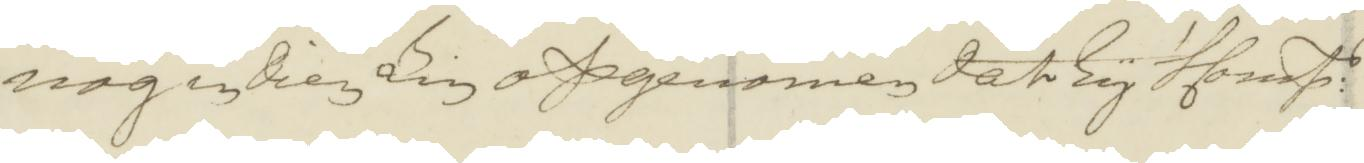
nog in dien zin opgenomen dat hij ’s Comp:s
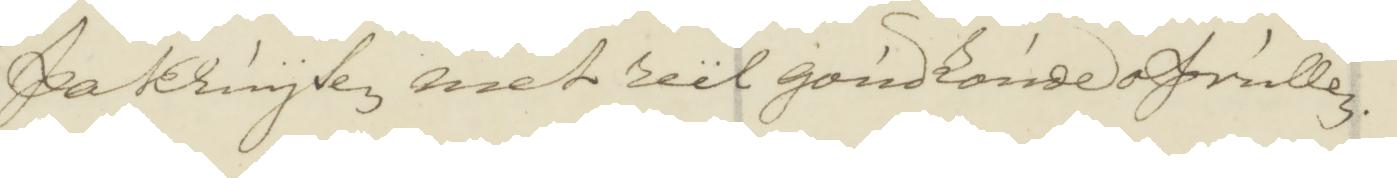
pakhuijsen met reël goud zoude opvullen.
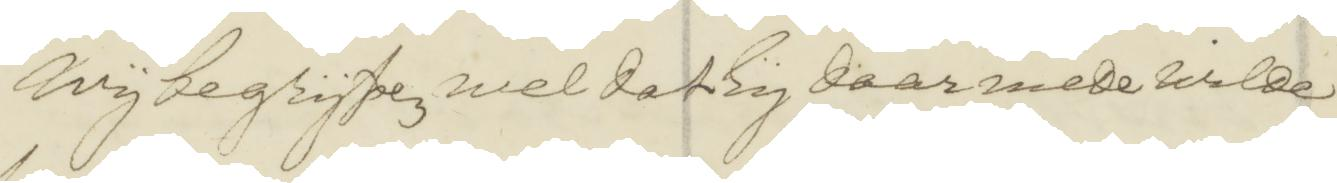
Wij begrijpen wel dat hij daar mede wilde
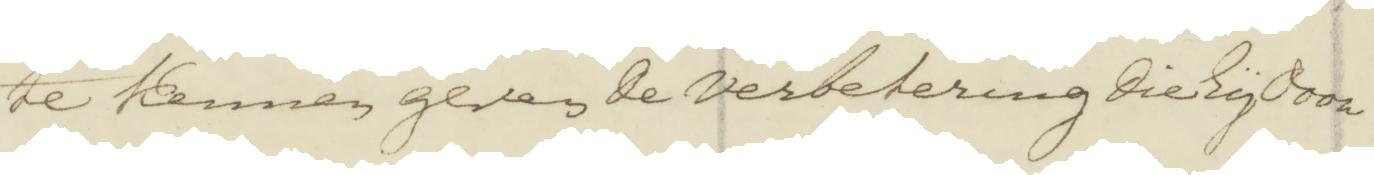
te kennen geven de verbetering die hij door
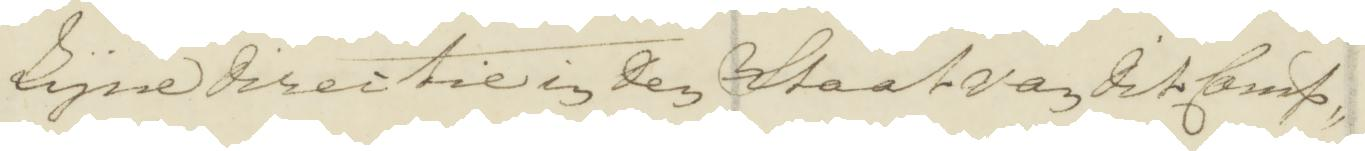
zijne directie in den staat van dit Comp„
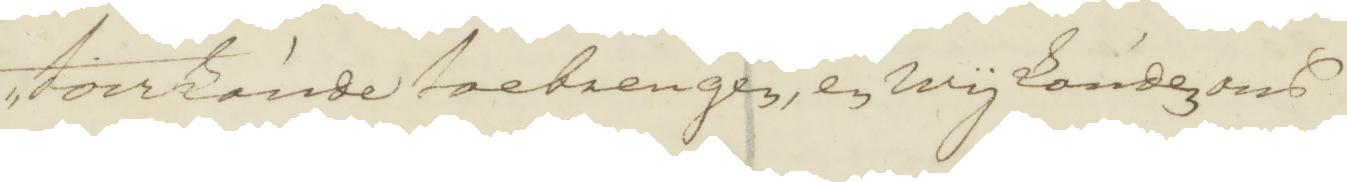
„toir zoude toebrengen, en wij zouden ons
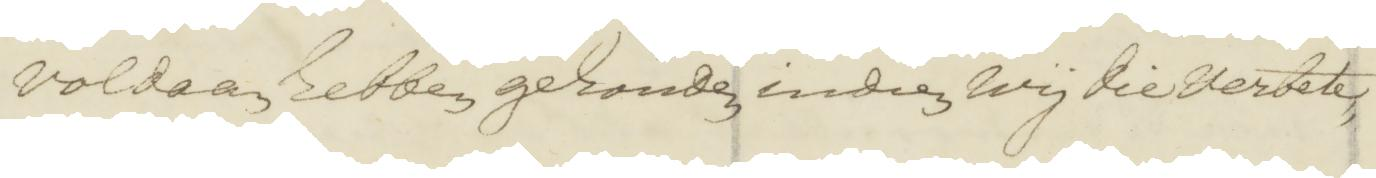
voldaan hebben gehouden indien wij die verbete„
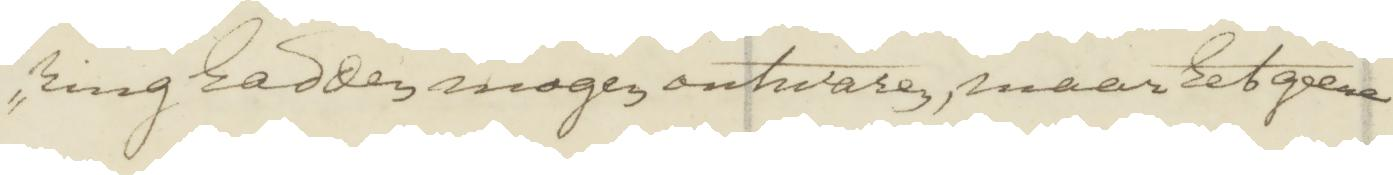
„ring hadden mogen ontwaren, maar het geene
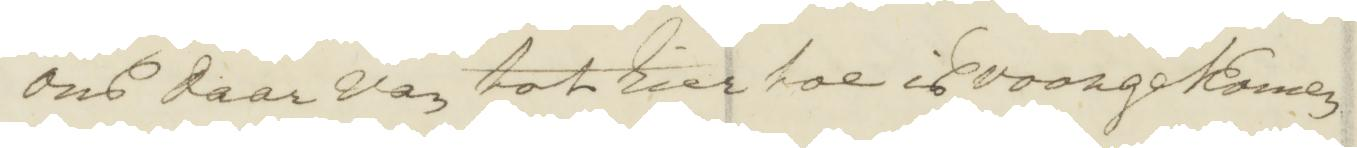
ons daar van tot hier toe is voorgekomen
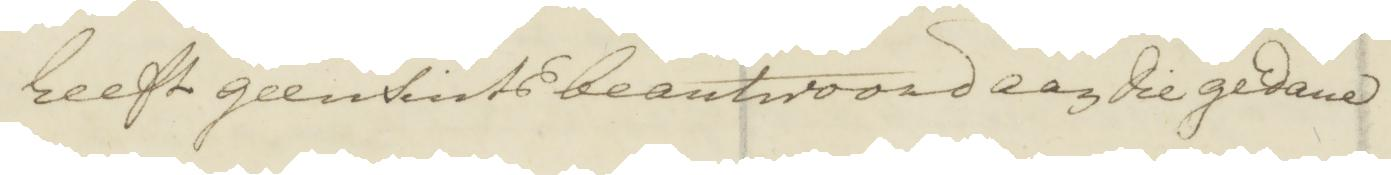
heeft geensints beantwoord aan die gedane
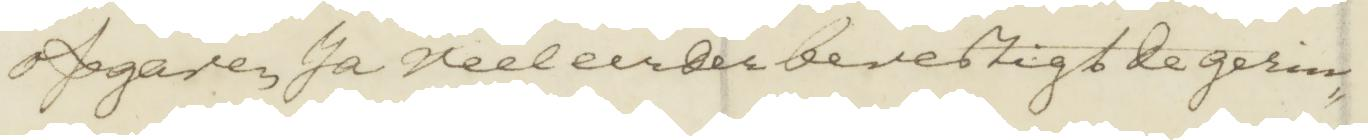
opgaven Ja veel eerder bevestigt de gerin„
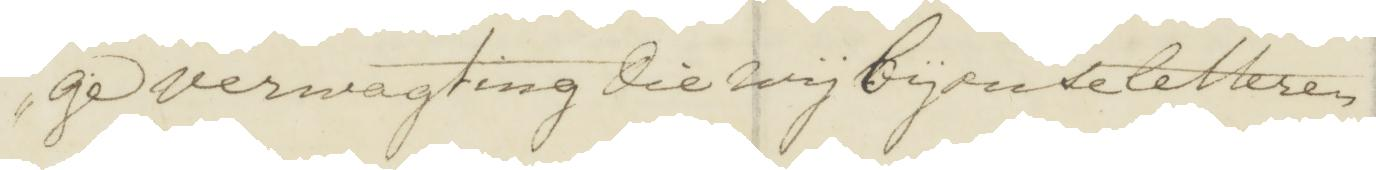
„ge verwagting die wij bij onse letteren
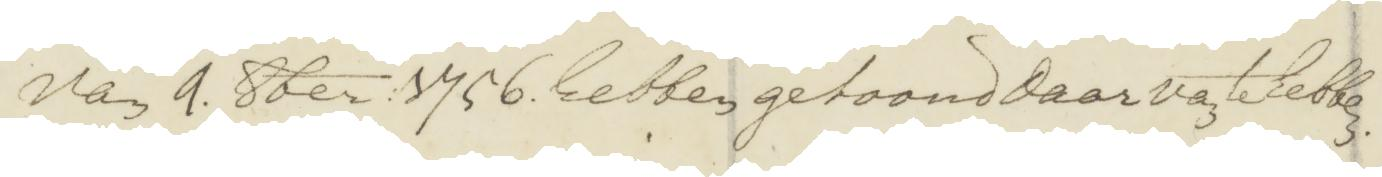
van 4. 8ber: 1756. hebben getoond daar van te hebben.
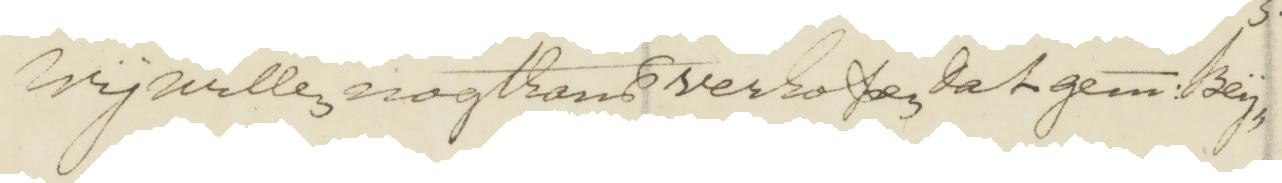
Wij willen nogthans verhopen dat gem: Beij„
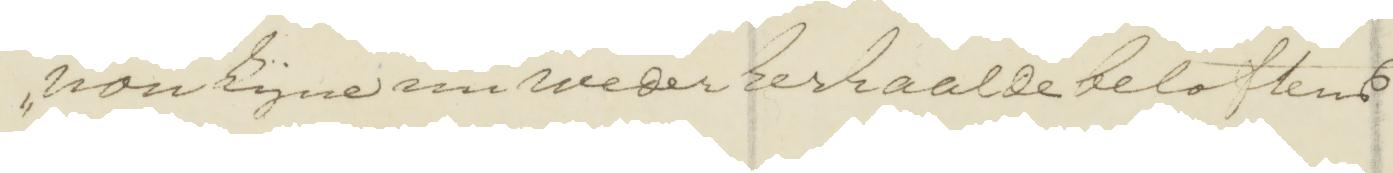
„non zijne nu weder herhaalde beloftens
